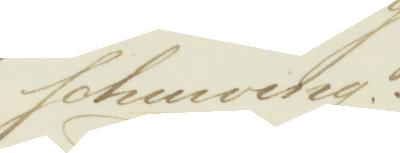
schuwing.
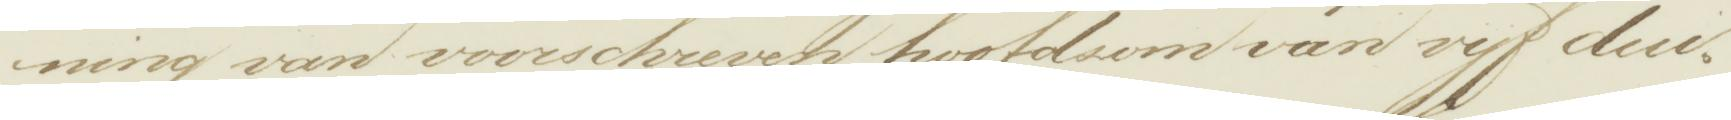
ning van voorschreven hoofdsom van vijf dui„
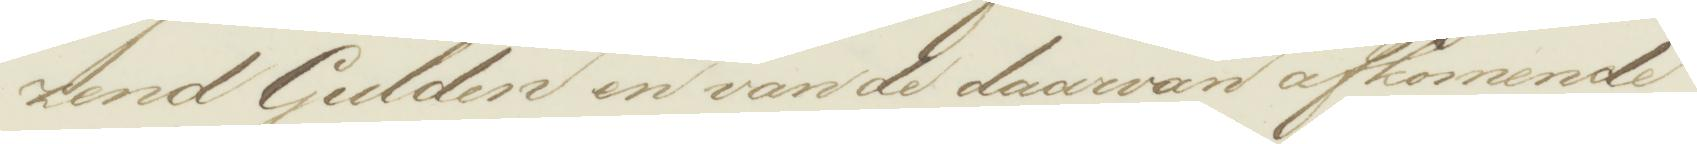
zend Gulden en van de daarvan afkomende
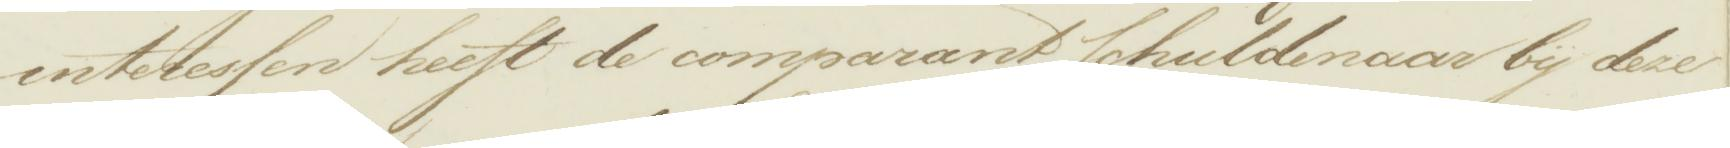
interessen heeft de comparant Schuldenaar bij deze
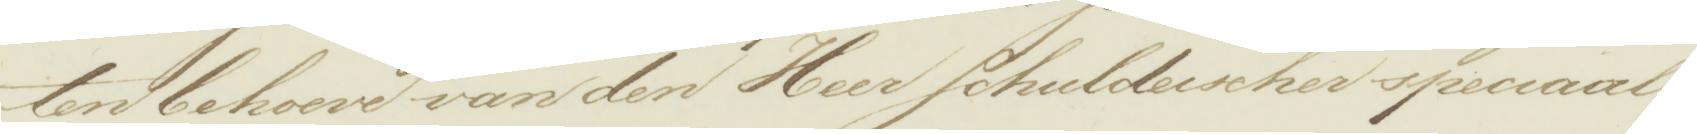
ten behoeve van den Heer Schuldeischer speciaal
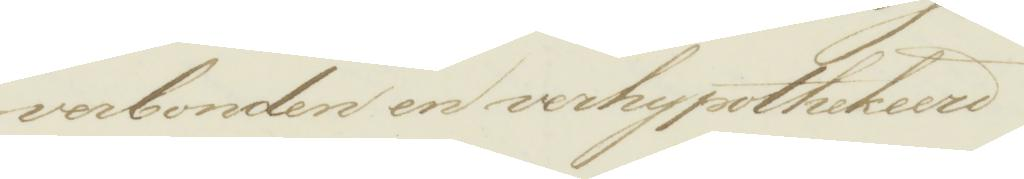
verbonden en verhypothekeerd
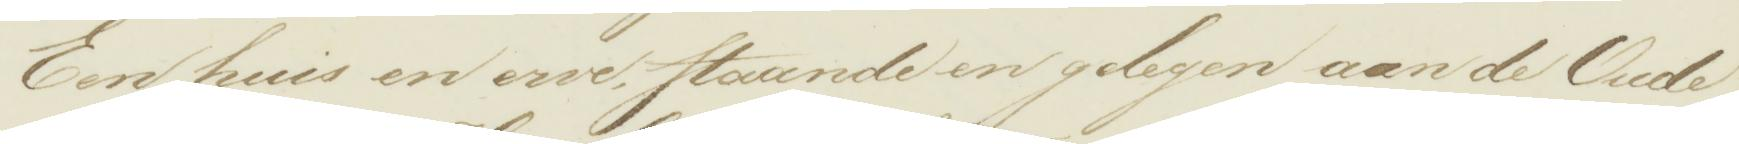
Een huis en erve, staande en gelegen aan de Oude
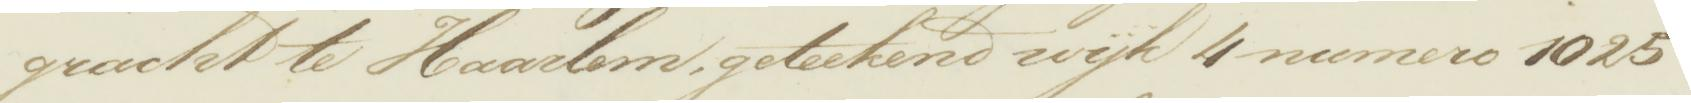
gracht te Haarlem, geteekend wijk 4 numero 1025
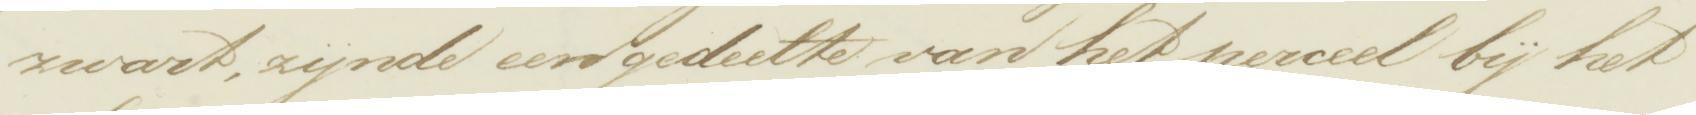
zwart, zijnde een gedeelte van het perceel bij het
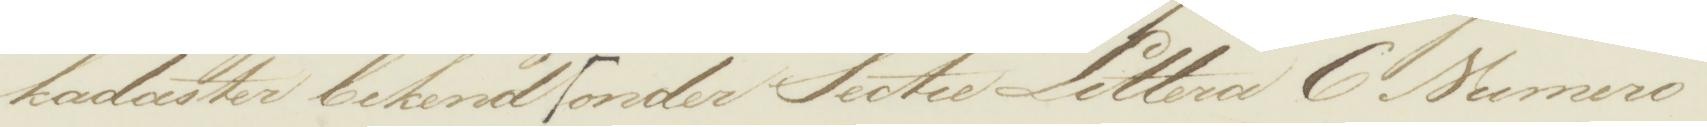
kadaster bekend ¶ onder Sectie Littera C Numero
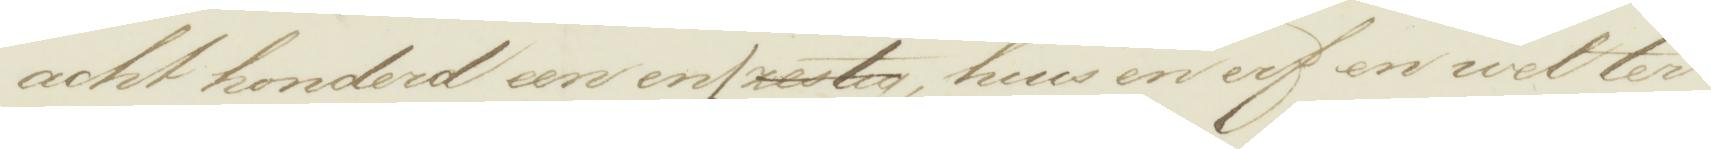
acht honderd een en¶ zestig, huis en erf en wel ter
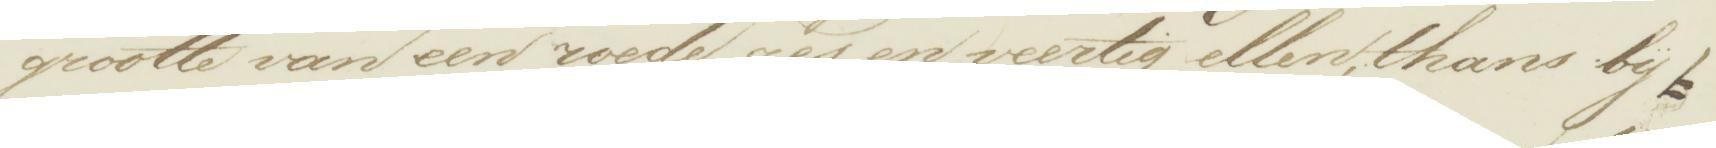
grootte van een roede zes en veertig ellen, thans bij¶
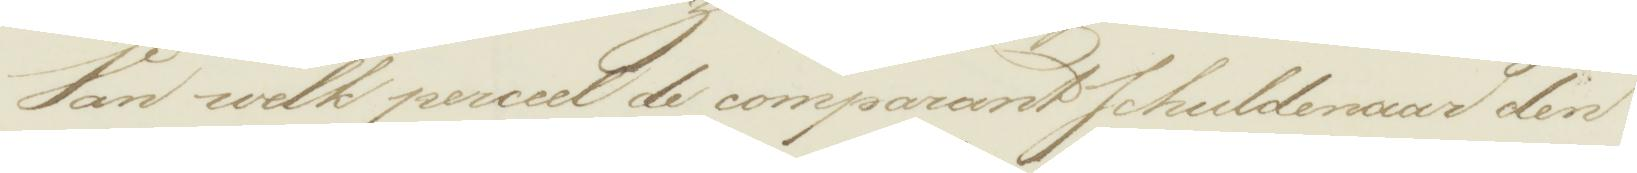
Van welk perceel de comparant Schuldenaar den
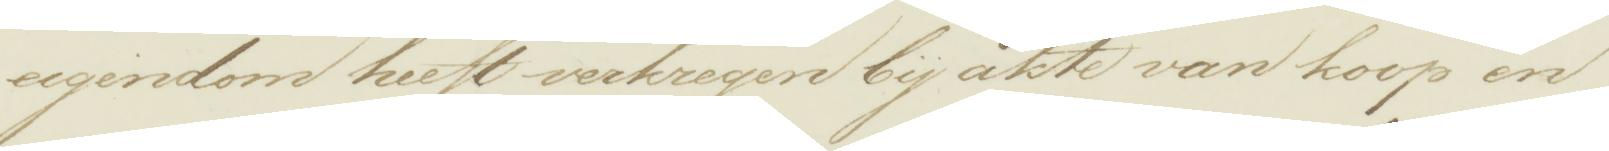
eigendom heeft verkregen bij akte van koop en
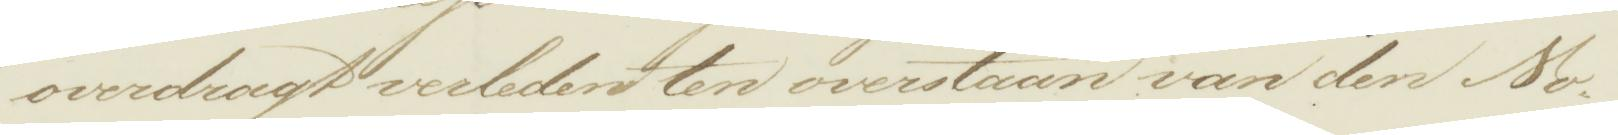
overdragt verleden ten overstaan van den No„
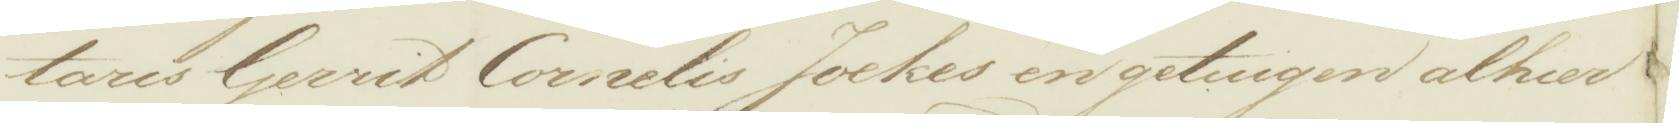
taris Gerrit Cornelis Joekes en getuigen alhier
